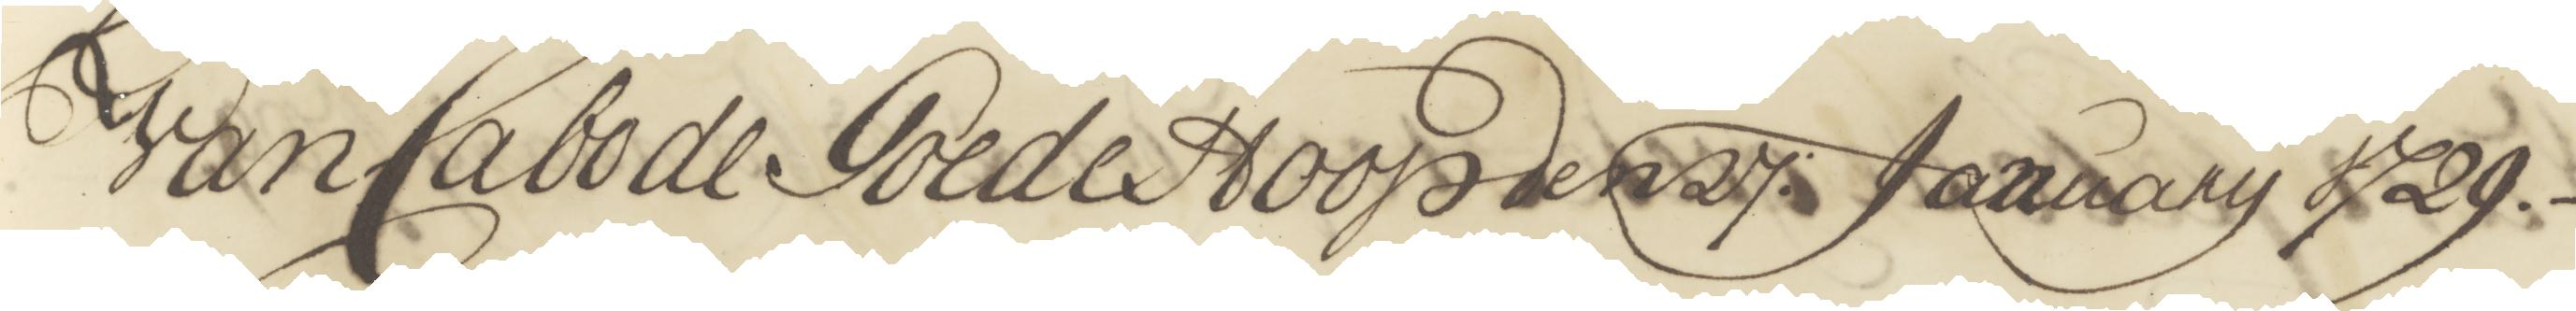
Van Cabo de Goede Hoop den 27. Januarij 1729.
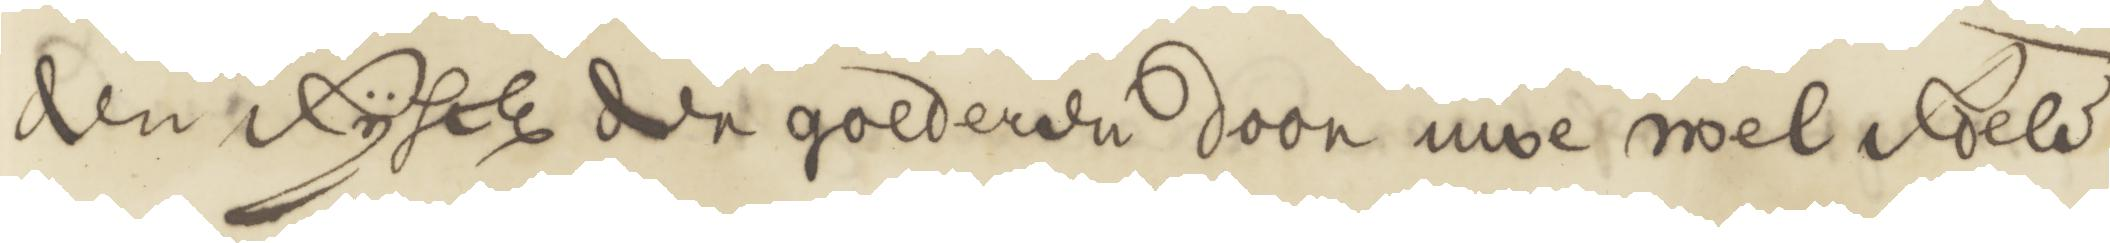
den Eijsch der goederen door uwe wel Edele
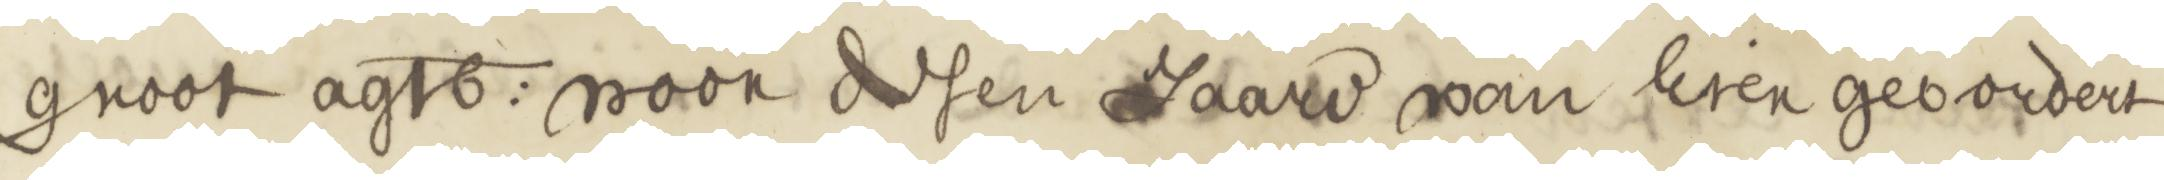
groot agtb: voor desen Iaare van hier gevordert
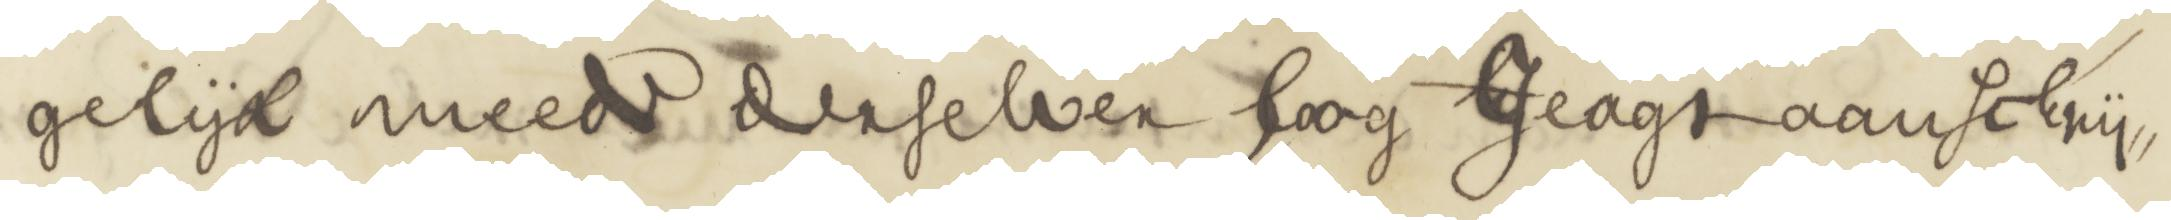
gelijk meede derselver hoog geagt aanschrij„
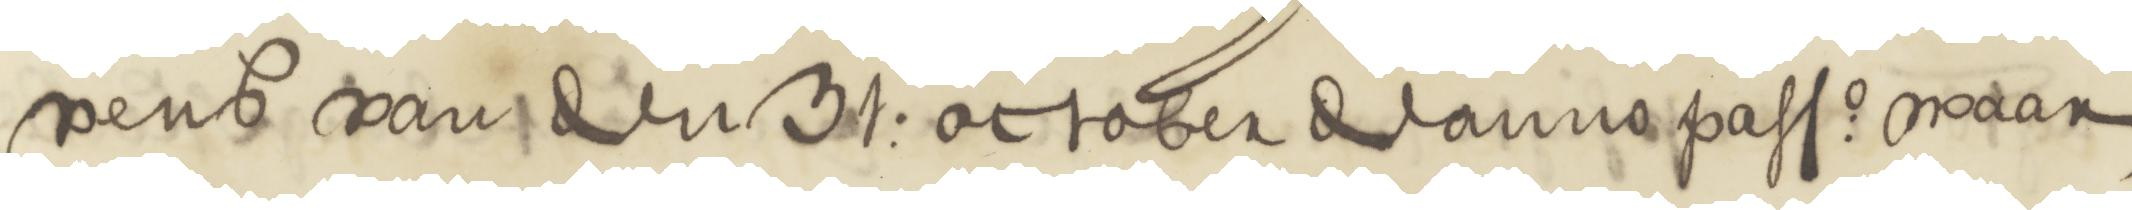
vens van den 31: october de anno pass:o waar
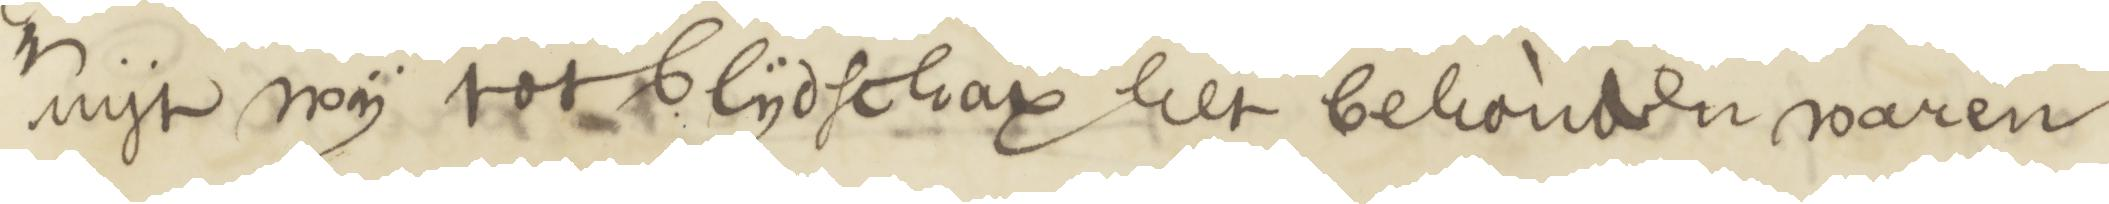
uijt wij tot blijdschap het behouden varen
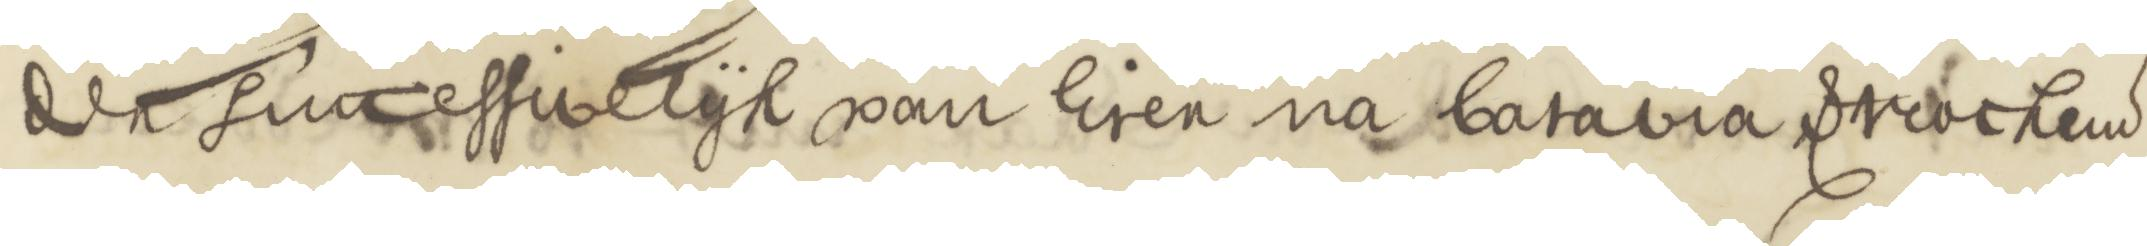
der successivelijk van hier na batavia vertrockene
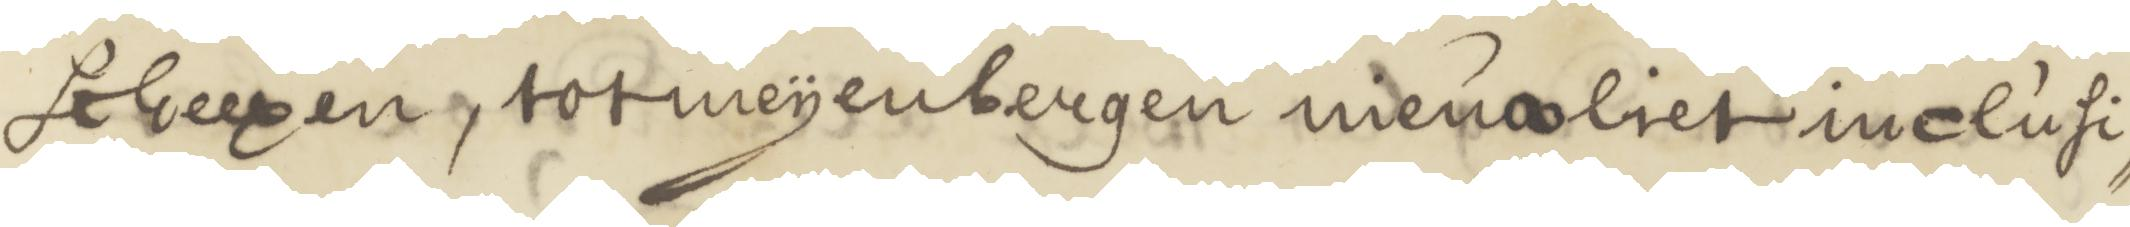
scheepen, tot meijenberg en nieuvliet inclusi
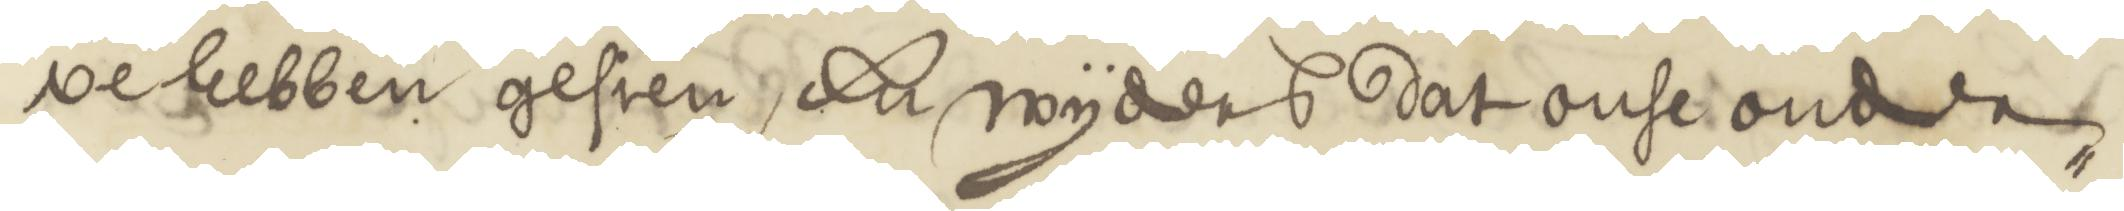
ve hebben gesien, En wijders dat onse onder„
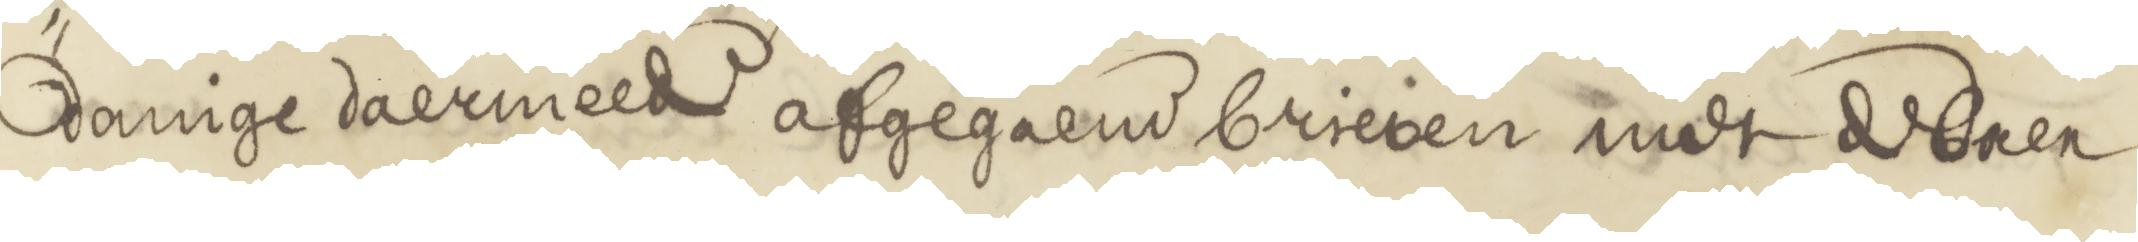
danige daermeede afgegaene brieven met de daer
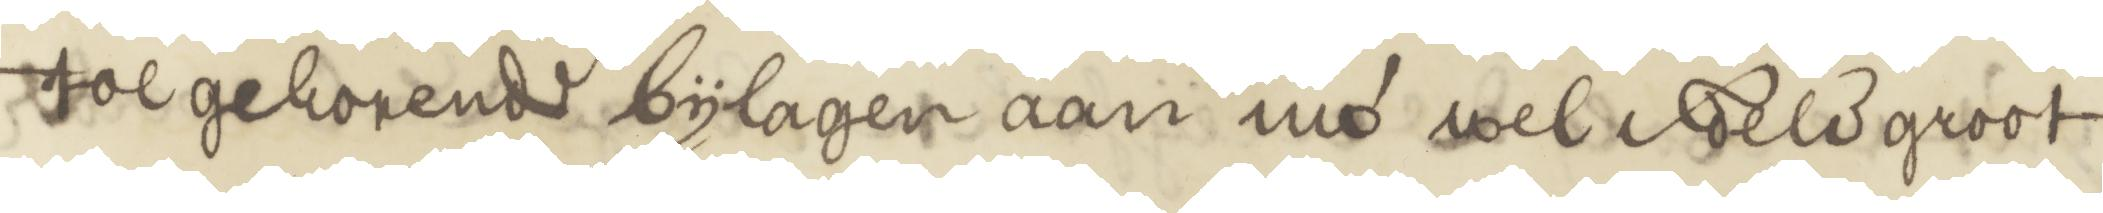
toe gehorende bijlagen aan uw' wel Edele groot
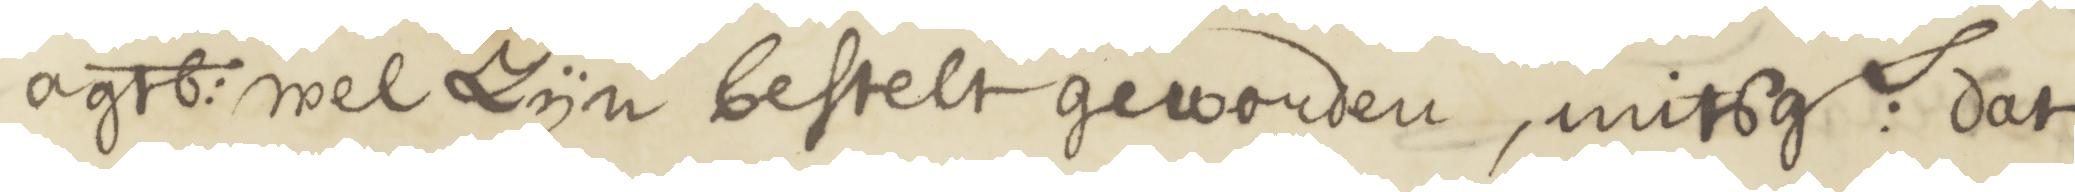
agtb: wel zijn bestelt geworden, mitsg:s dat
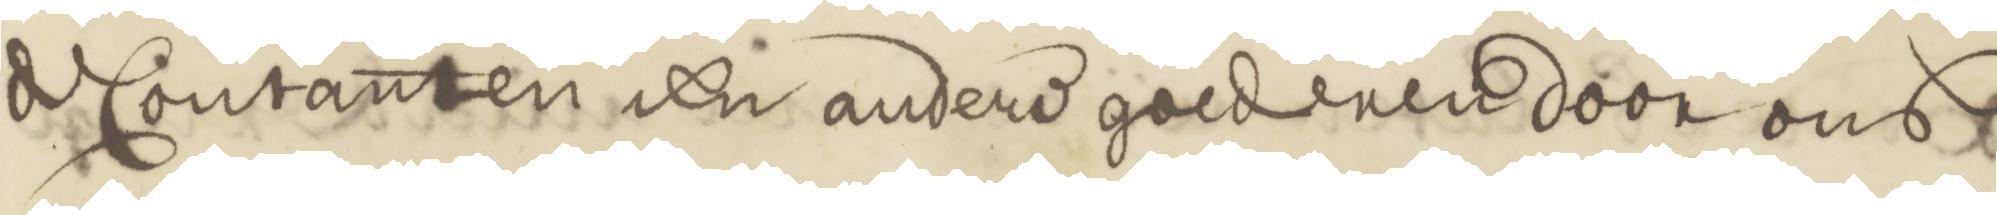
de Contanten En andere goederen door ons
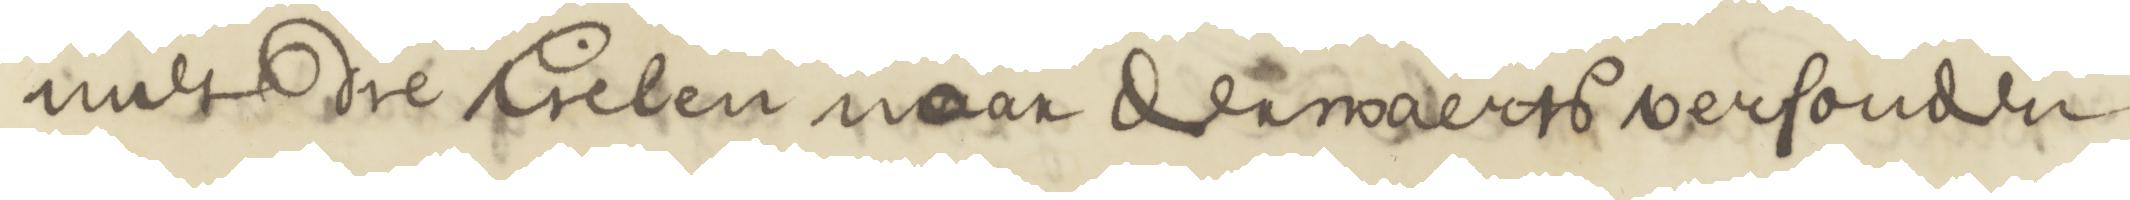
met die kielen naar derwaerts versonden
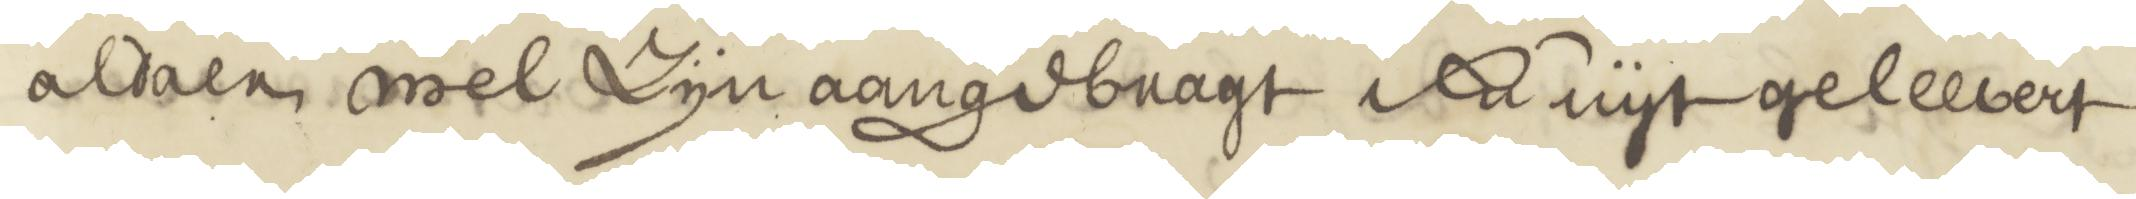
aldaer wel zijn aangebragt En uijt geleevert
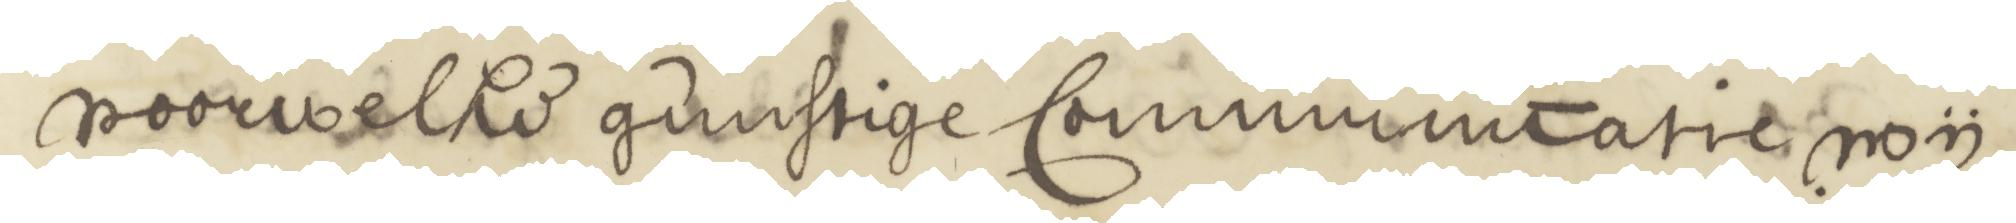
voorwelke gunstige Communicatie wij
